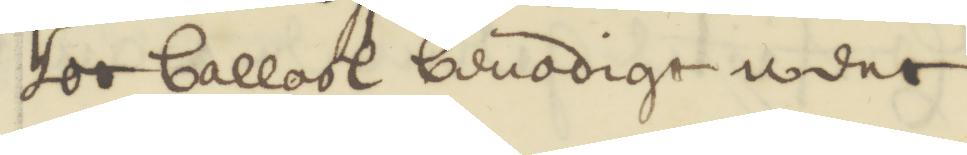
tot ballast benodigt wert.
